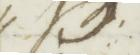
„ 13:
